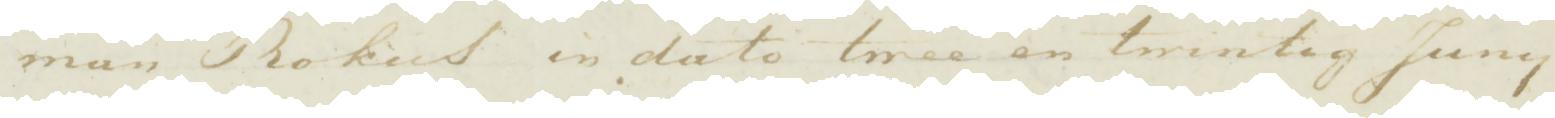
man Rokus in dato twee en twintig Juny
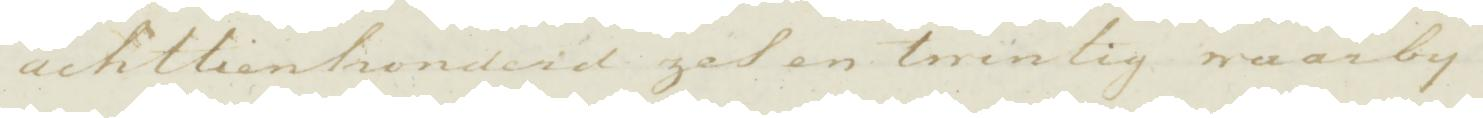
achttienhonderd zes en twintig waarby
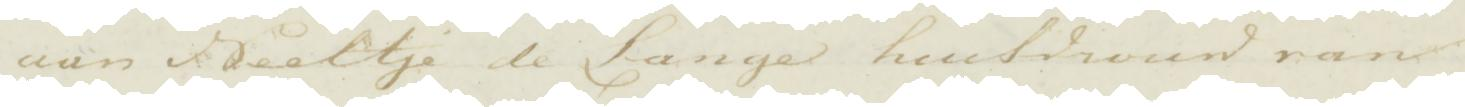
aan Neeltje de Lange huisvrouw van
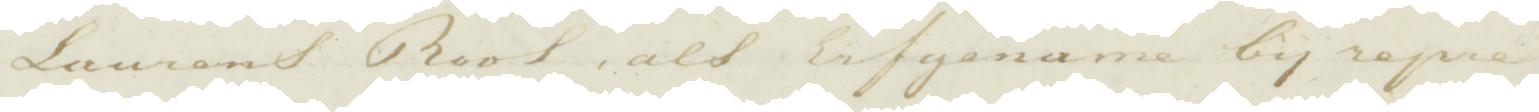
Laurens Roos, als Erfgename bij repre
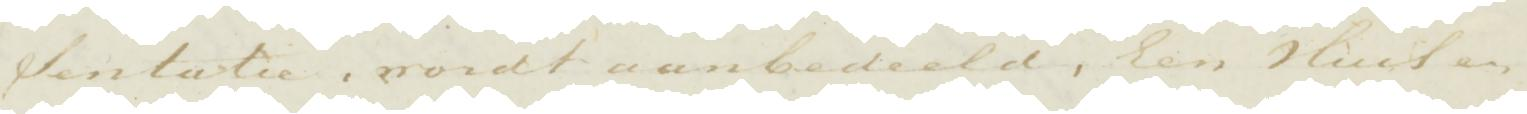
sentatie, wordt aanbedeeld, Een Huis en
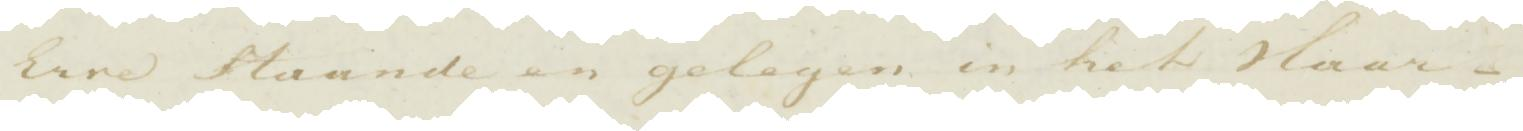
Erve staande en gelegen, in het Haar
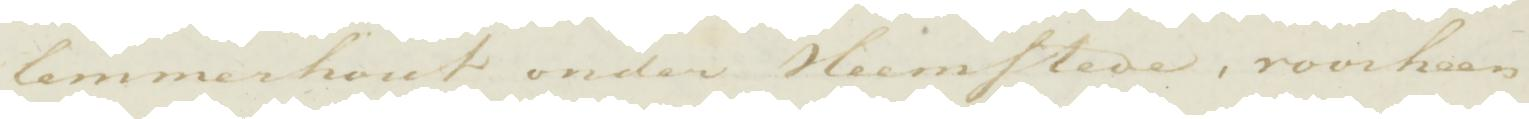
lemmerhout onder Heemstede, voor heen
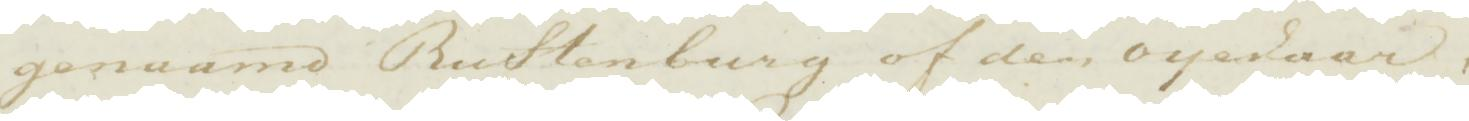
genaamd Rustenburg of den oyevaar,
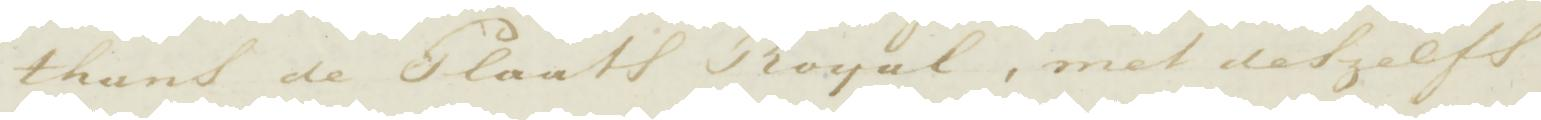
thans de Plaats Royal, met deszelfs
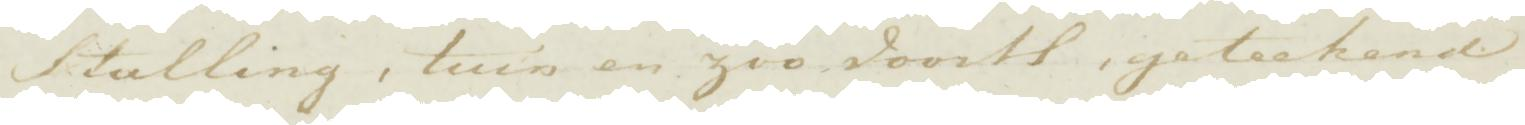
stalling, tuin en zoo voorts, geteekend
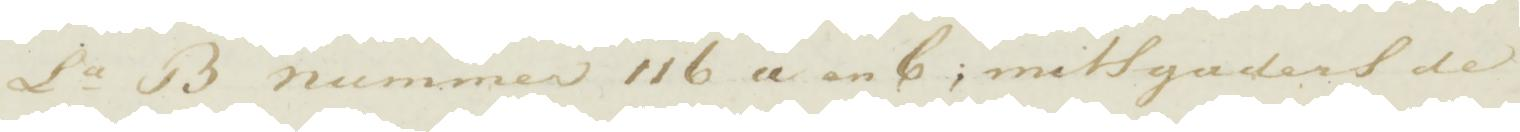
L_a B nummer 116 a en b; mitsgaders de
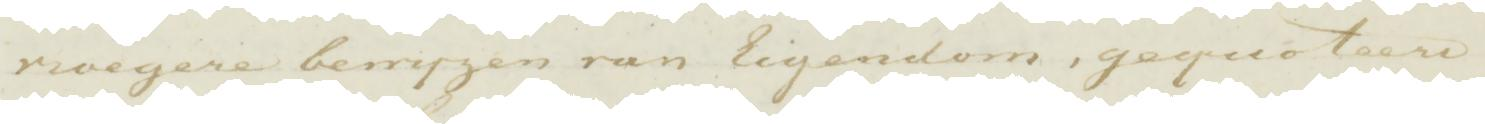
vroegere bewyzen van Eigendom, gequoteerd
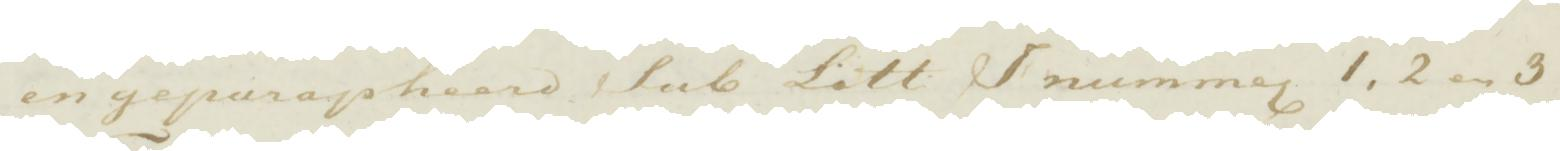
en geparapheerd sub Litt I nummer 1. 2 en 3
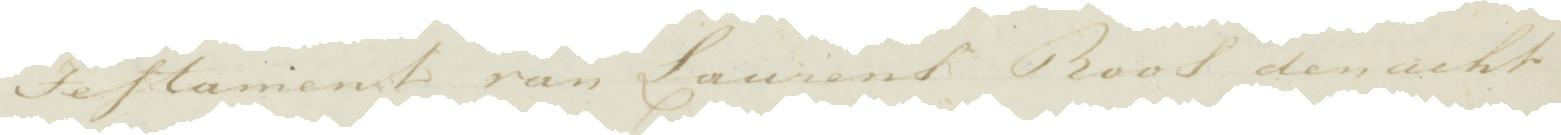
Testament van Laurens Roos den acht
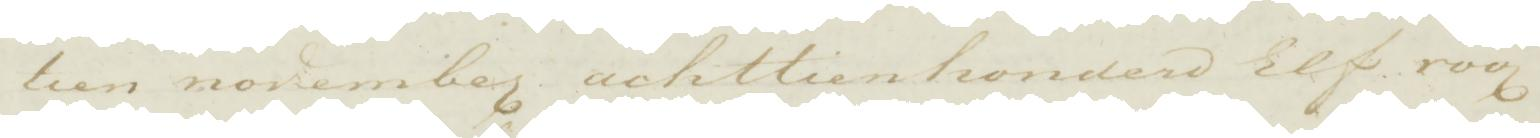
tien november achttien honderd Elf voor
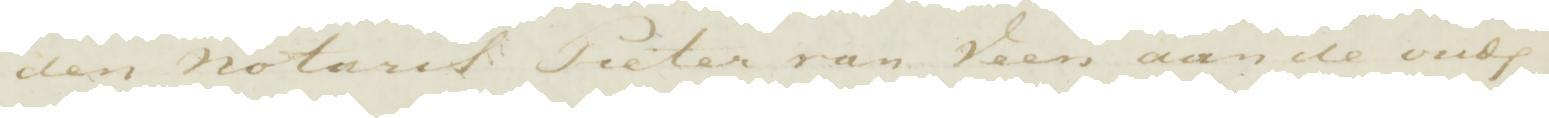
den notaris Pieter van Veen aan de oude
